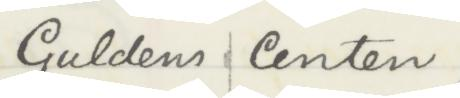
Guldens Centen
